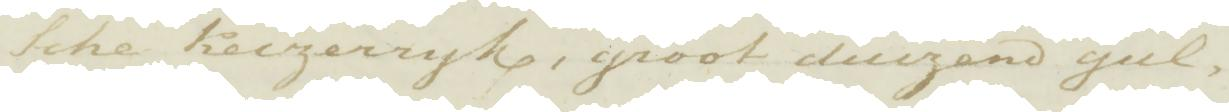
sche keizerryk, groot duizend gul,
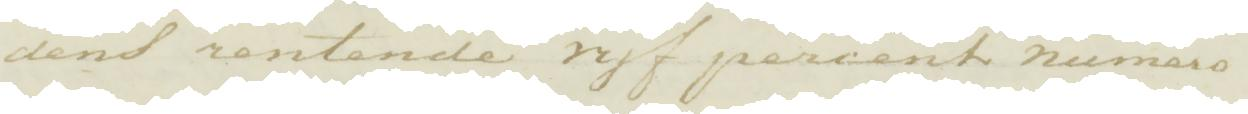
dens rentende vyf percent numero
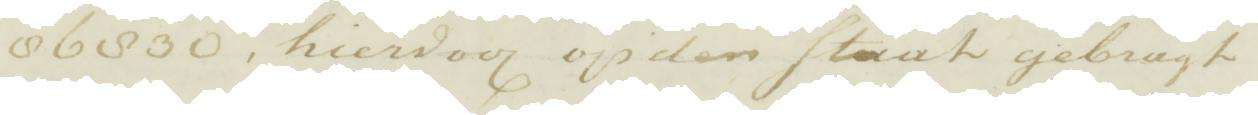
86830, hiervoor op den staat gebragt
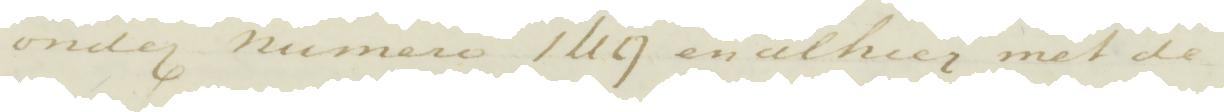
onder numero 149 en alhier met de
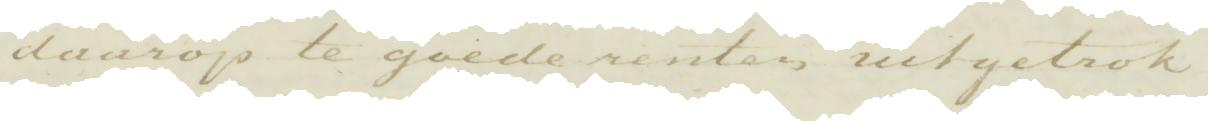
daarop te goede renten uitgetrok
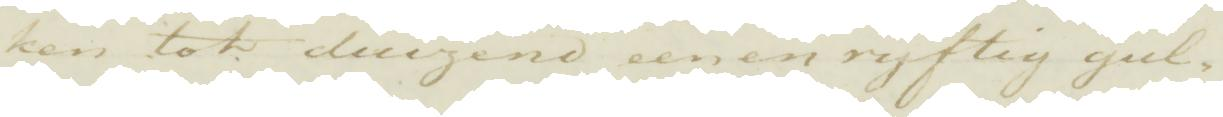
ken tot duizend eenen vyftig gul„
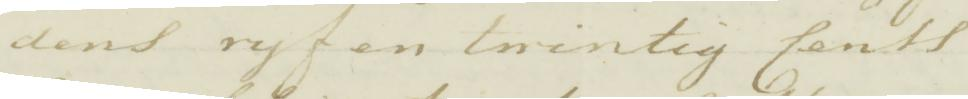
dens vyf en twintig Cents
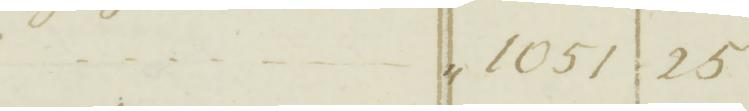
„ 1051 25
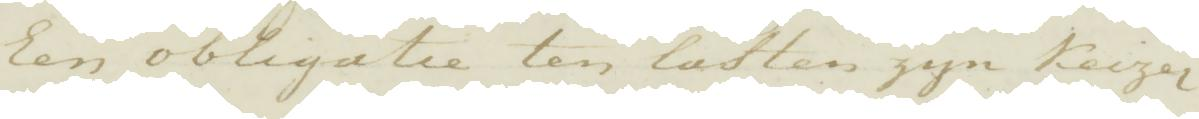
Een obligatie ten lasten zyn keizer
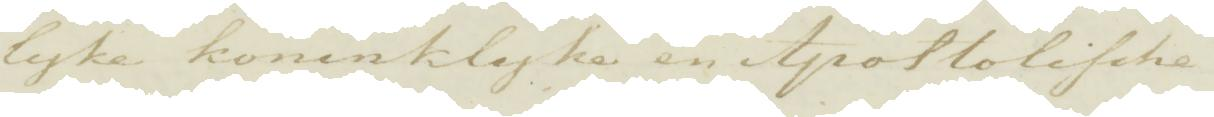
lyke koninklyke en Apostolische
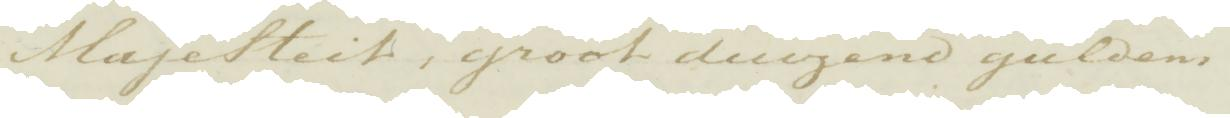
Majesteit, groot duizend guldens
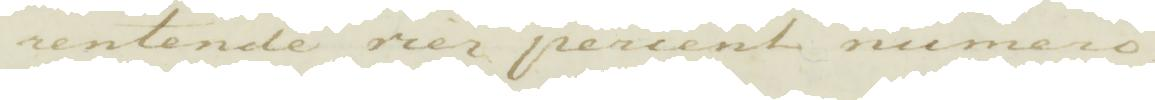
rentende vier percent numero
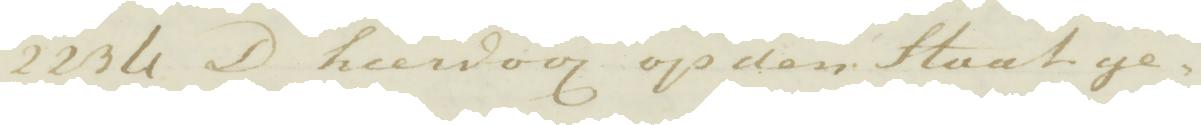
2234 D hiervoor op den staat ge„
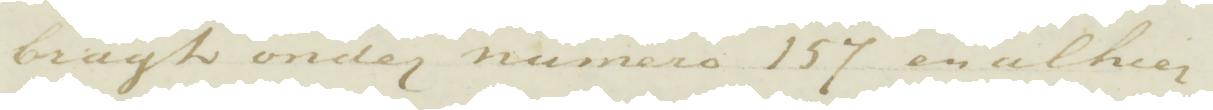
bragt onder numero 157 en alhier
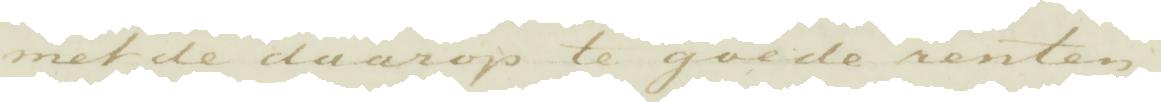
met de daarop te goede renten
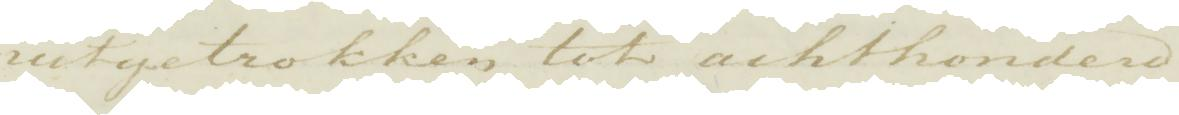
uitgetrokken tot achthonderd
